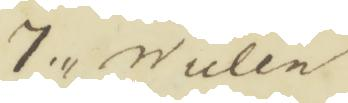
7.„ wielen
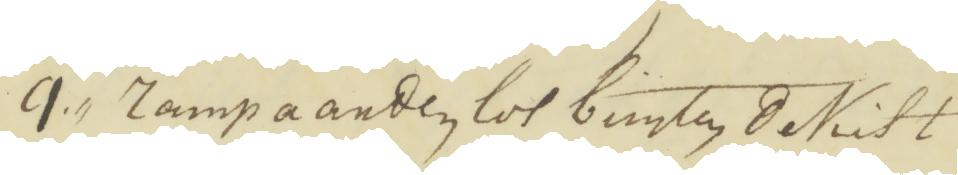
4.„ rampaarden los buijten de kist
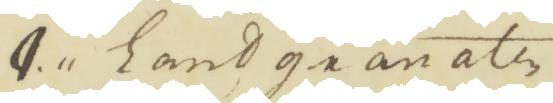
4.„ hand granaten
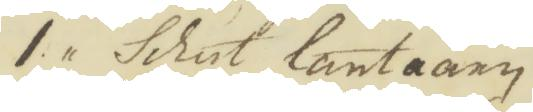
1.„ schut lantaarin
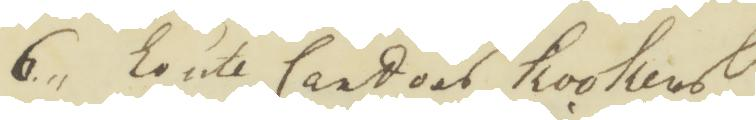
6.„ houte Cardoes kookers
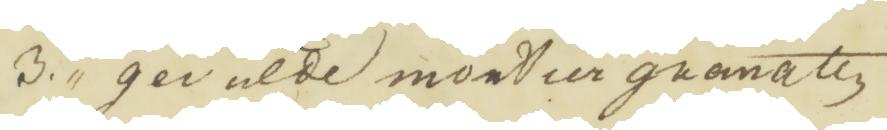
3.„ gevulde mortier gronaten
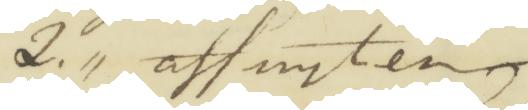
2.„ affuijten
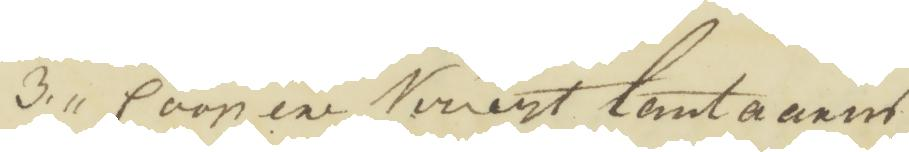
3.„ coopere kruijt lantaarns
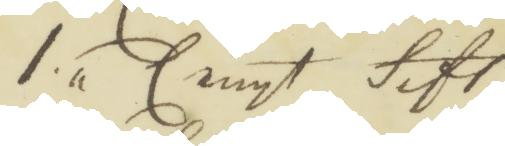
1.„ cruijt sift
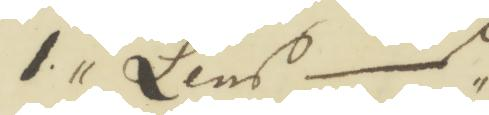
1.„ lens _„o
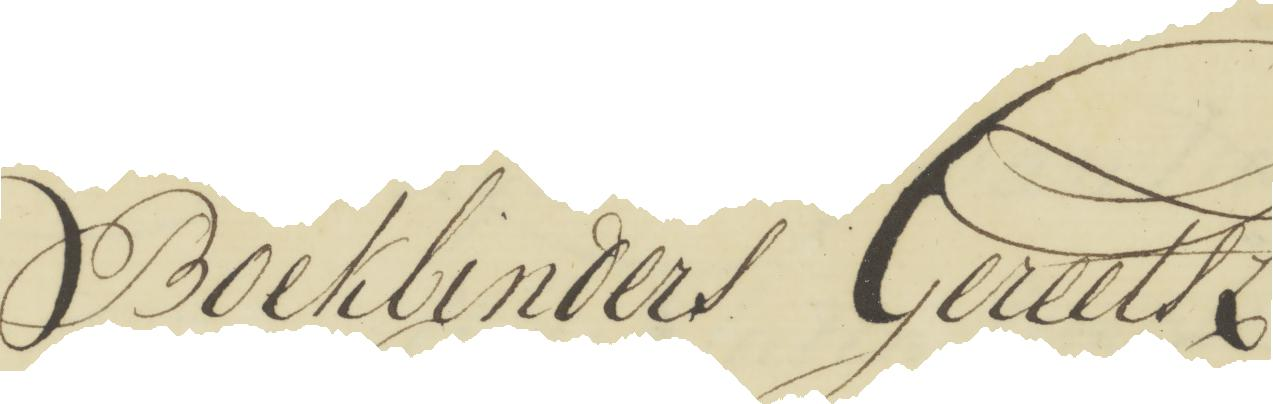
Boekbinders Gereetsz:
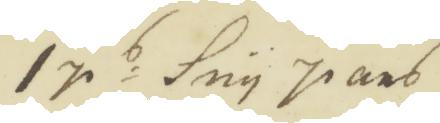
1. p:s snij pars
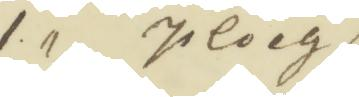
1„ ploeg
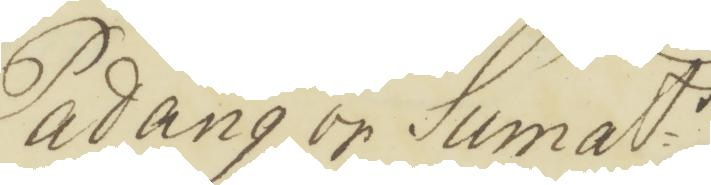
Padang op Sumat:s
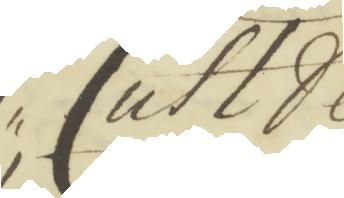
W:t Cust den
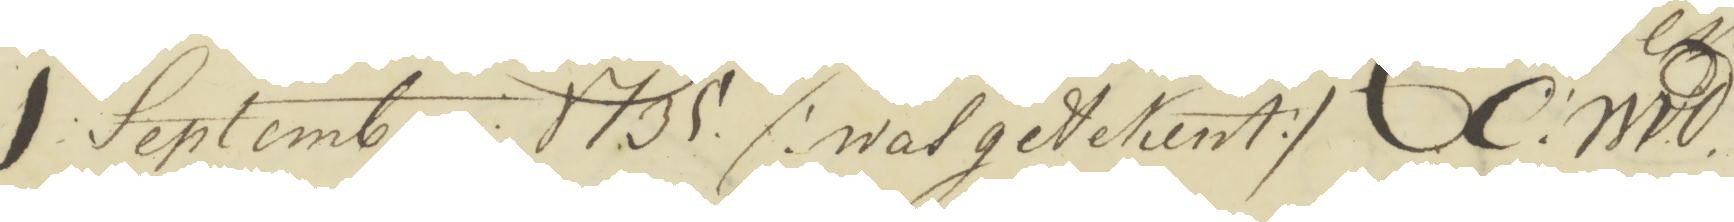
1:' September: 1735. /:was getekent./ C: w.d:
